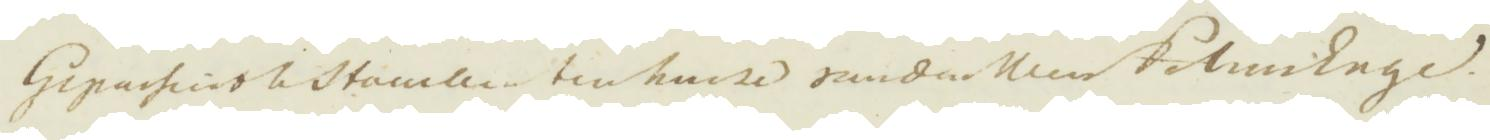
Gepasseert te Haarlem ten huize van den Heer Petrus Enge-
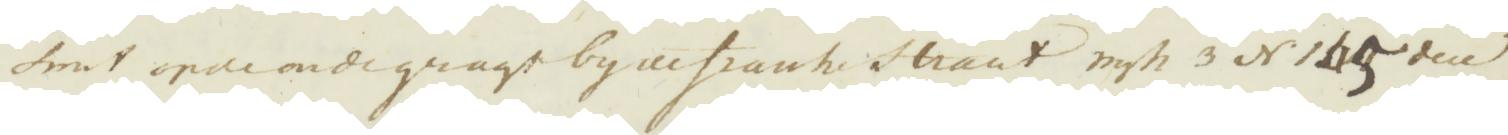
smit opde oude gragt by de franke straat wyk 3 No 145 den
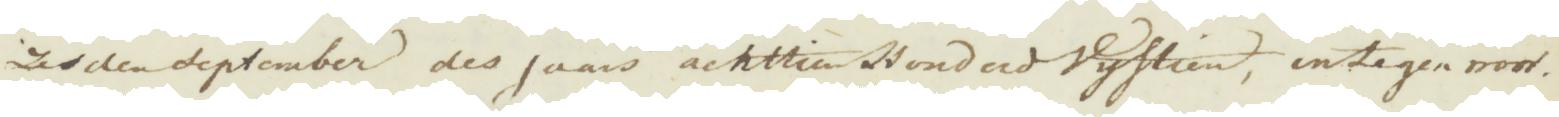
zesden september des jaars achttien Honderd Vyftien, in tegen woor=
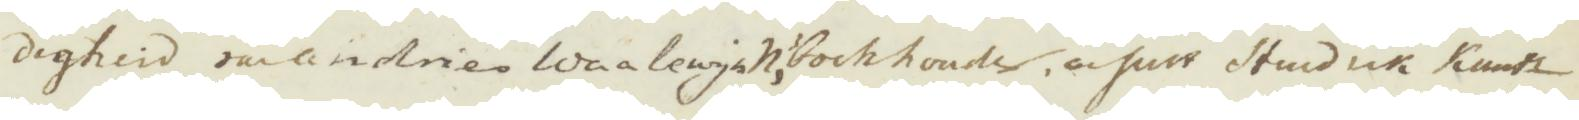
digheid van Andries Waalewijn N:' boekhouder, en just Hendrik Kunst
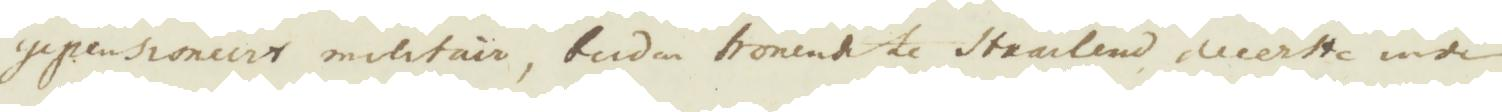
gepensioneert militair, beiden wonende te Haarlem de eerste in de
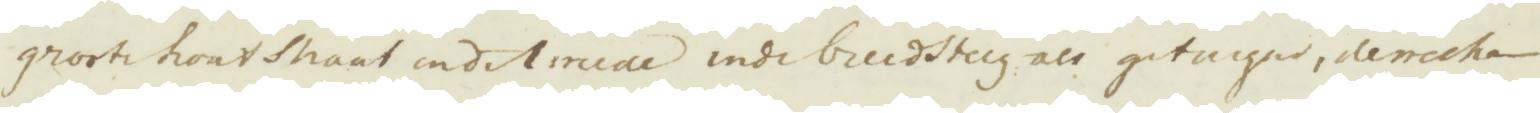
groote houtstraat en de tweede inde breedsteeg als getuigen, dewelke
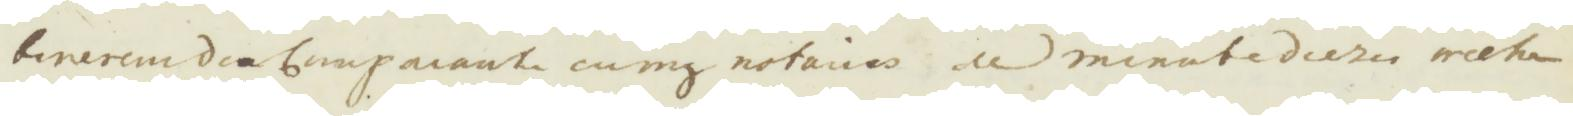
benevens den Comparante en my notaris de minute deeze welke
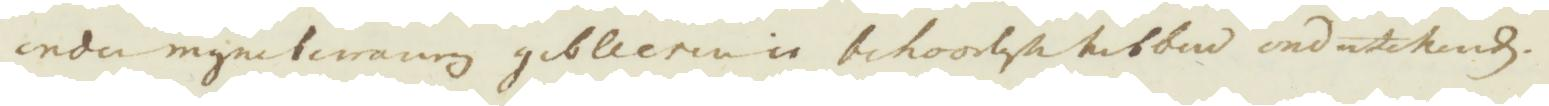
onder mijne bewaring gebleeven is behoorlyk hebben ondertekend.
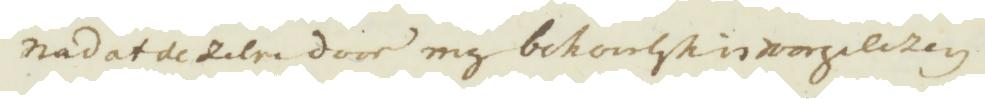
na dat dezelve door my behoorlyk is voorgelezen
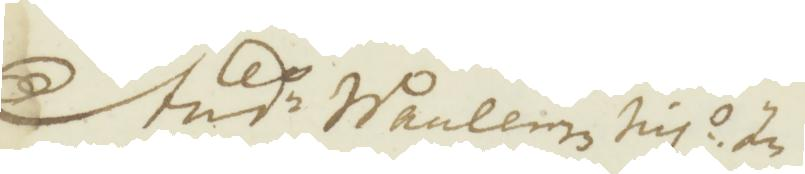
And:s Waalewijn Nic:o Zn
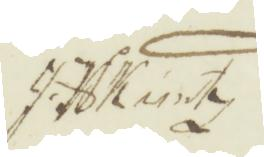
J. H Kuntz
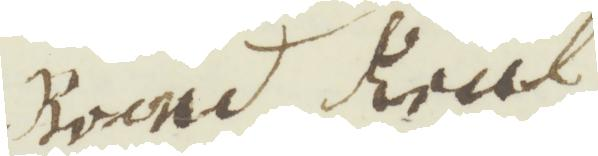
Barend Krul
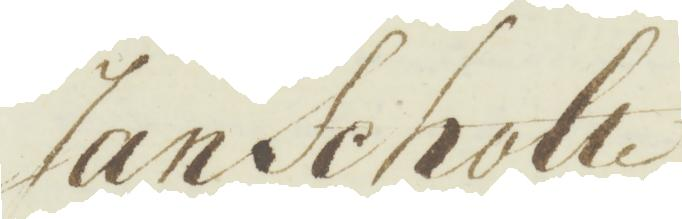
Jan Scholte
